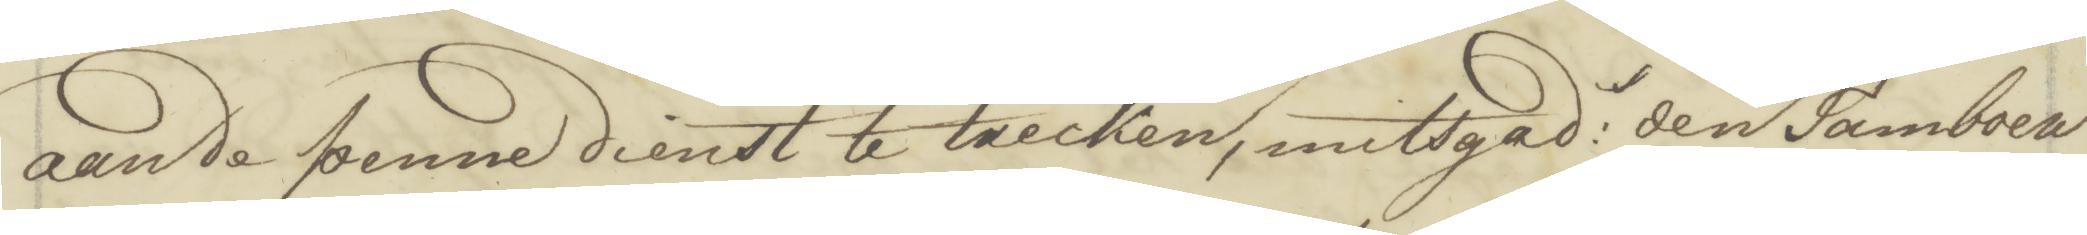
aan de penne dienst te trecken, mitsgad:s den Tamboer
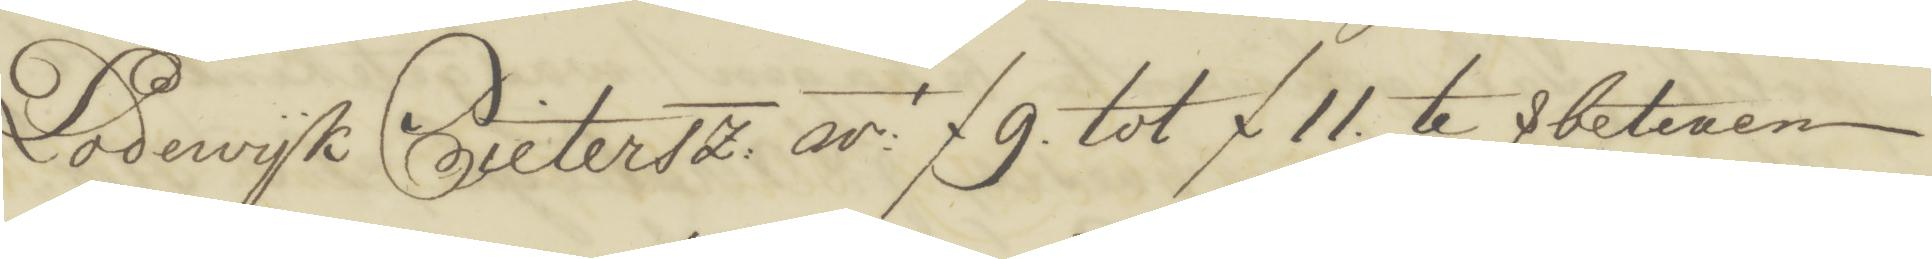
Lodewijk Pietersz: ar: ƒ9. tot ƒ11. te verbeteren
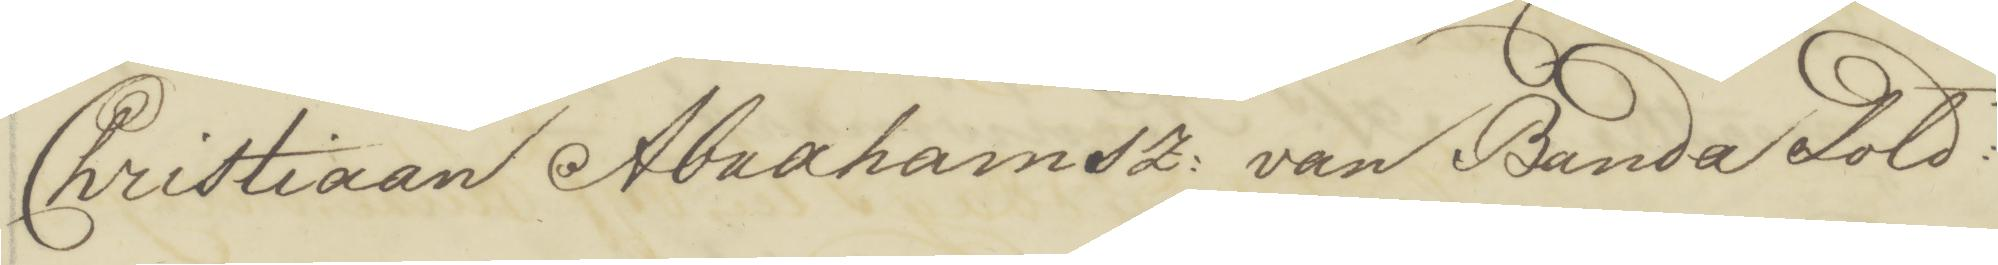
Christiaan Abrahamsz: van Banda sold
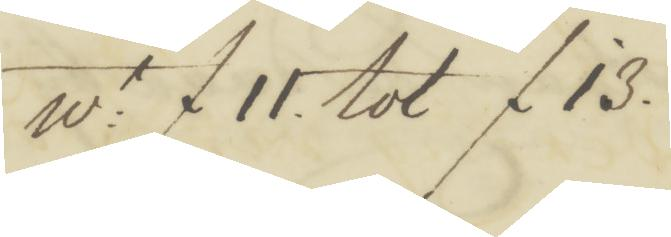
w:t ƒ 11. tot ƒ 13.
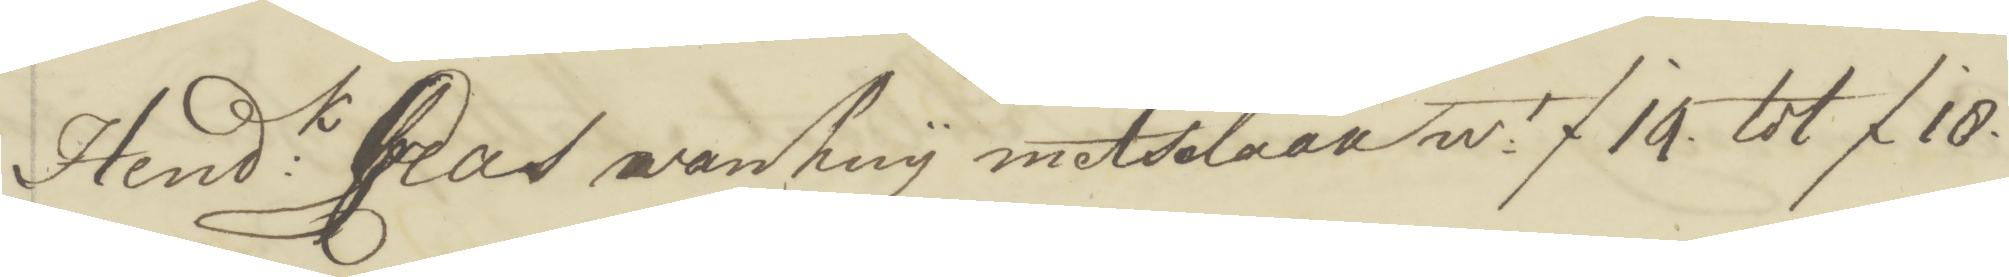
Hend:k Gras van huij metselaar w:t ƒ 14. tot ƒ18.
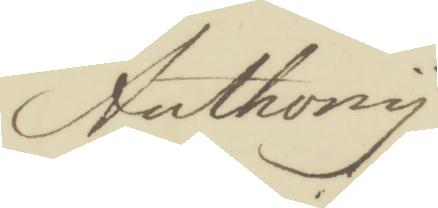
Anthonij
